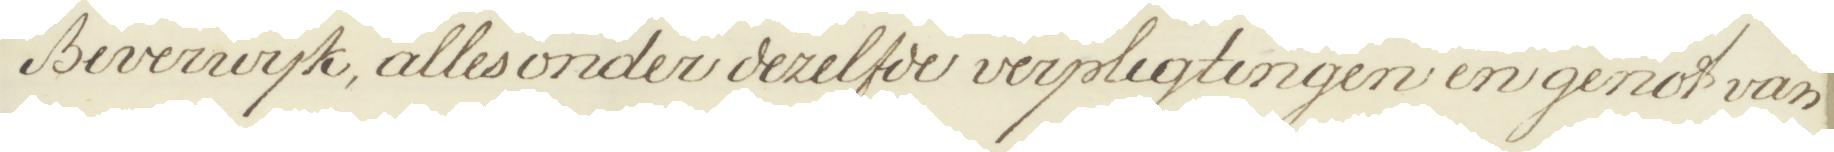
Beverwyk, alles onder dezelfde verpligtingen en genot van
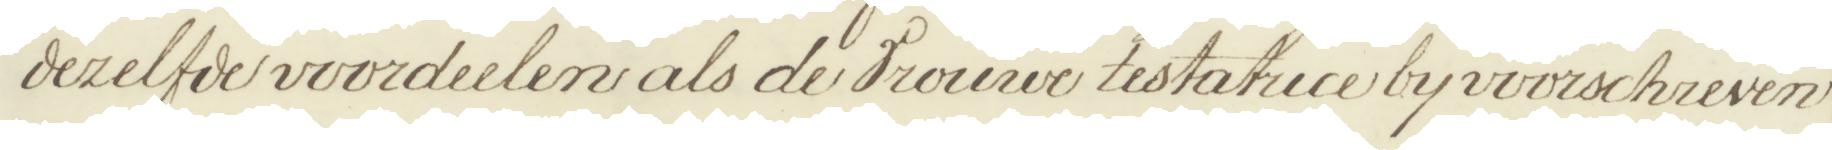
dezelfde voordeelen als de Vrouwe testatrice by voorschreven
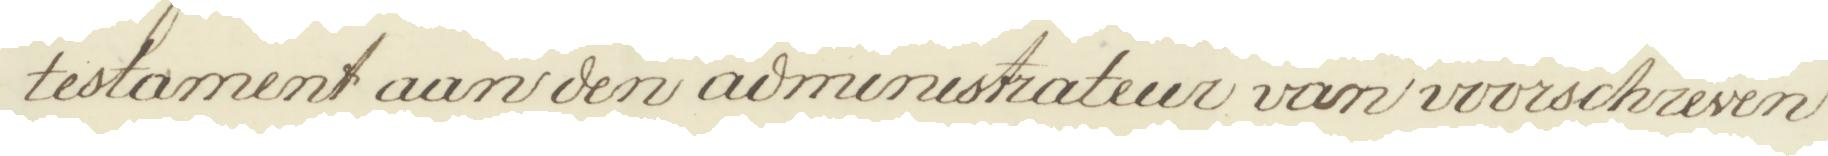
testament aan den administrateur van voorschreven
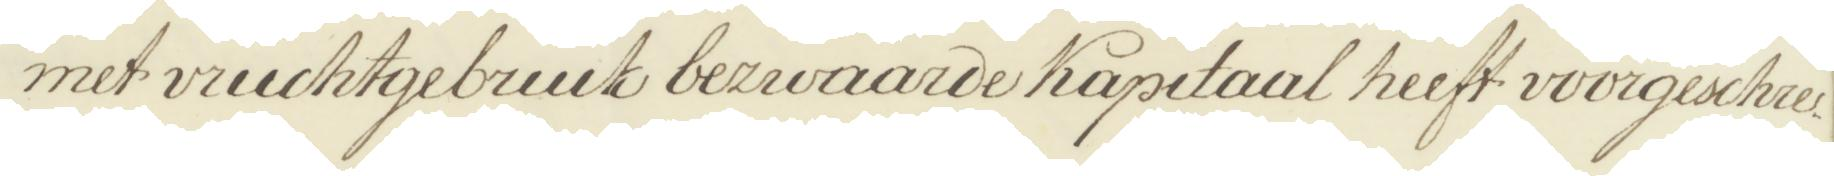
met vruchtgebruik bezwaarde Kapitaal heeft voorgeschre„
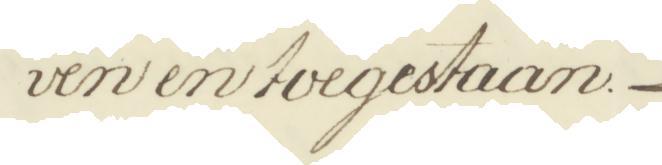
ven en toegestaan.-
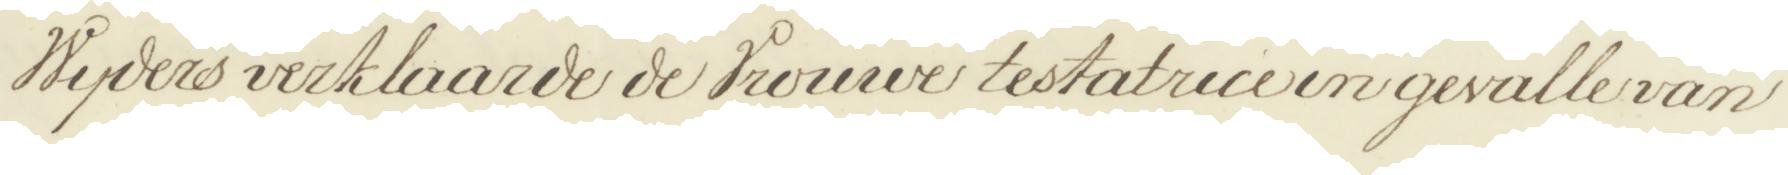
Wyders verklaarde de Vrouwe testatrice in gevalle van
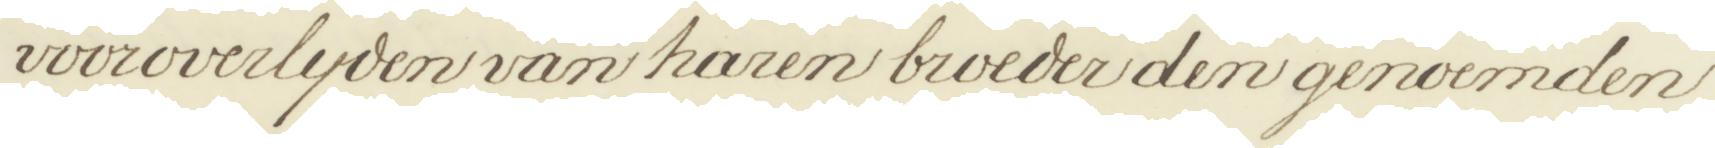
vooroverlyden van haren broeder den genoemden
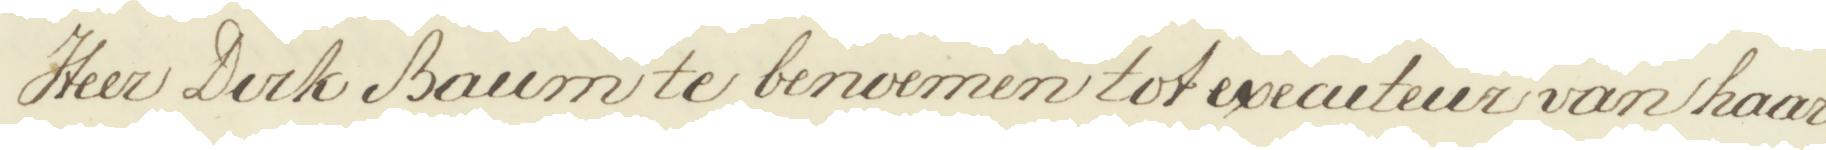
Heer Dirk Baum te benoemen tot executeur van haar
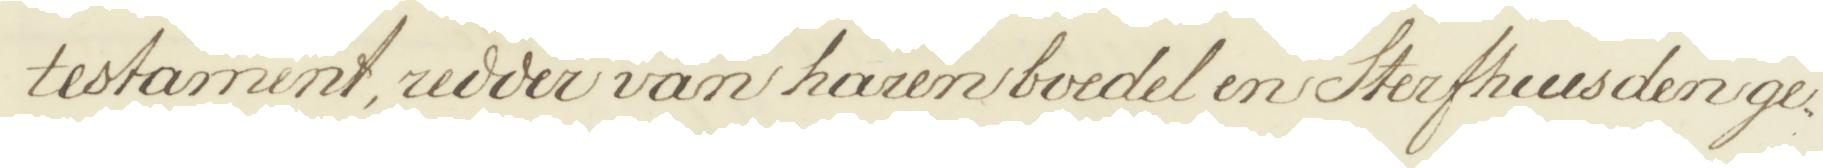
testament, redder van haren boedel en sterfhuis den ge„
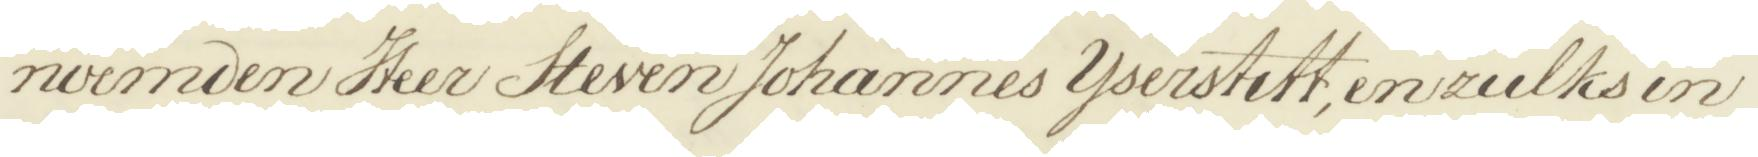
noemden Heer Steven Johannes Yserstitt, en zulks in
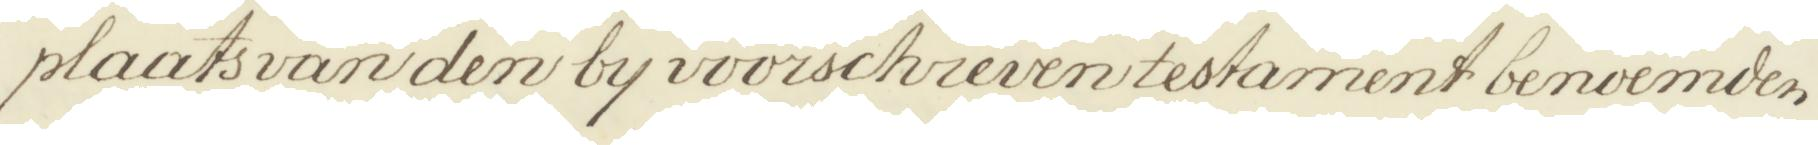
plaats van den by voorschreven testament benoemden
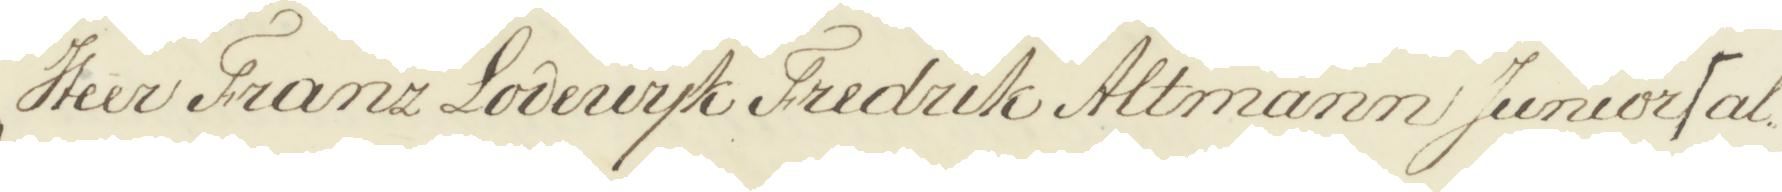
Heer Franz Lodewyk Fredrik Altmann Junior ¶ al„
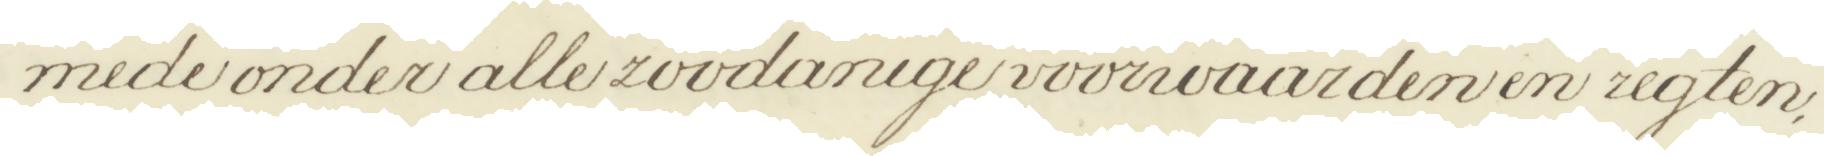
mede onder alle zoodanige voorwaarden en regten,
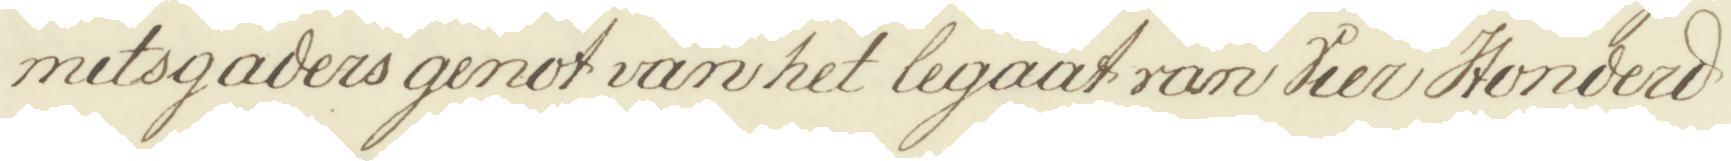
mitsgaders genot van het legaat van Vier Honderd
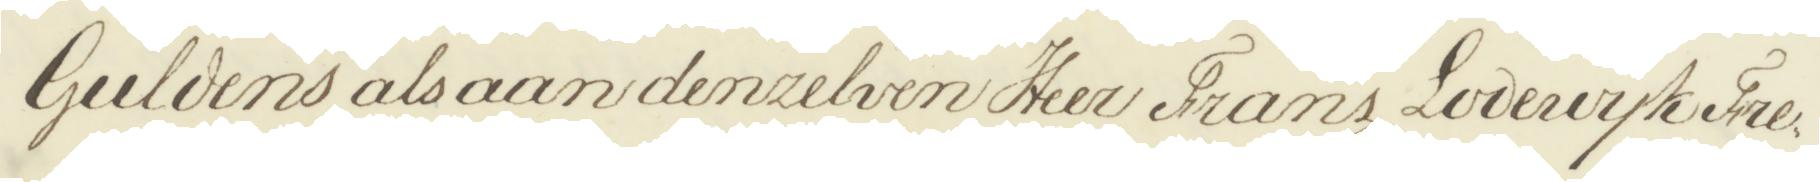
Guldens als aan denzelven Heer Franz Lodewyk Fre„
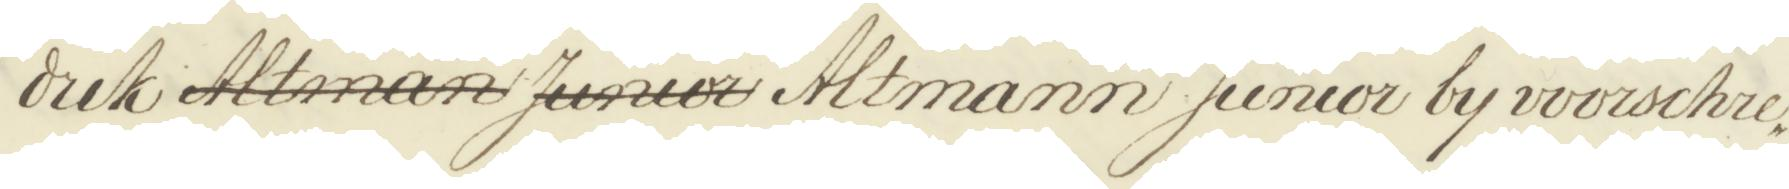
drik Altman Junior Altmann Junior by voorschre„
